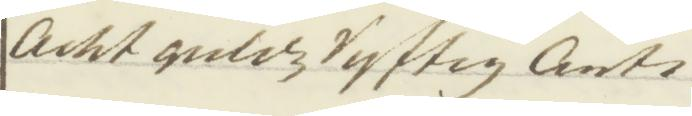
Acht gulden Vyftig Cents
